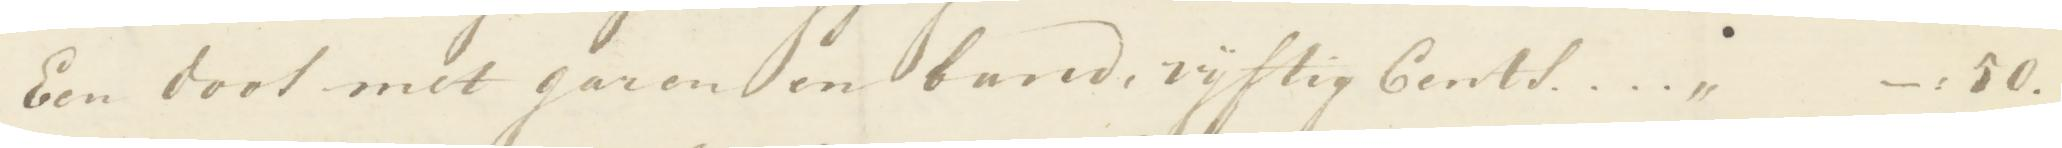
Een doos met garen en band, vijftig Cents . . . . . . . . . „ —:50.
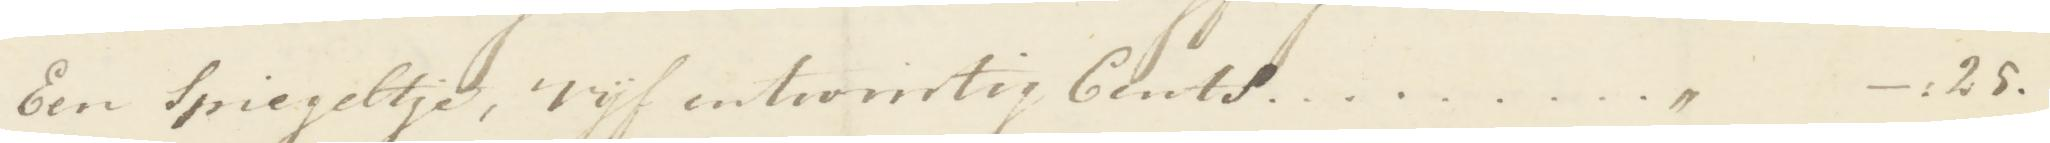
Een spiegeltje, vijf en twintig Cents. . . . . . . .. . . . . . . . „ —:25.
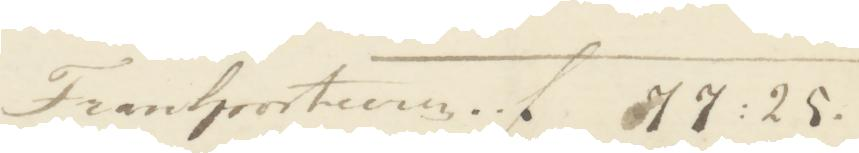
Transporteeren f 77:25.
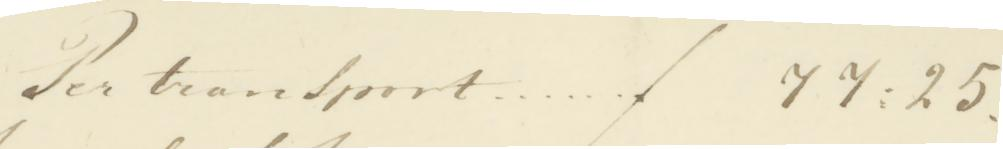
Per transport 77:25
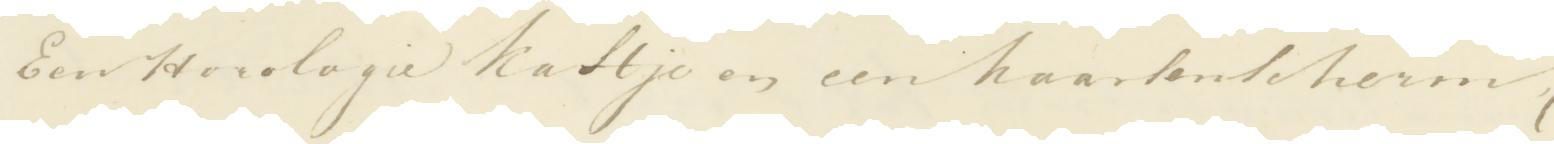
Een Horologie kastje en een kaarsenscherm,
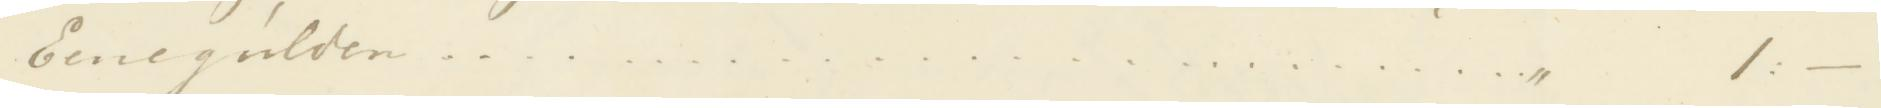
Eene gulden. . . . . . . . . .. . . . . . .. . . . . . . . . . .. . „ 1:—
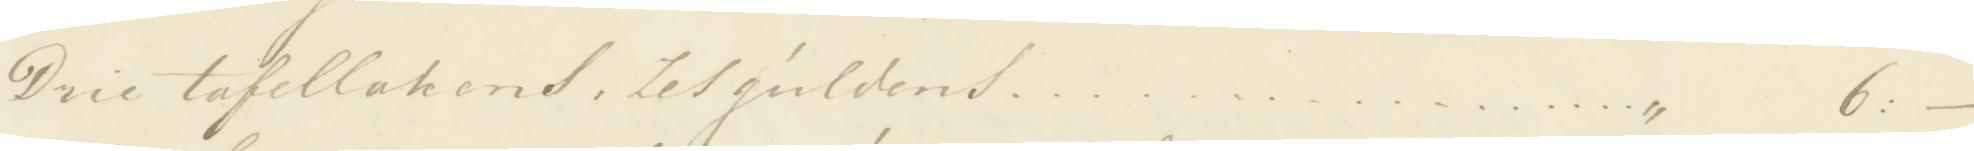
Drie tafellakens, zes guldens. . . . . . . . . . . . . . . „ 6:—
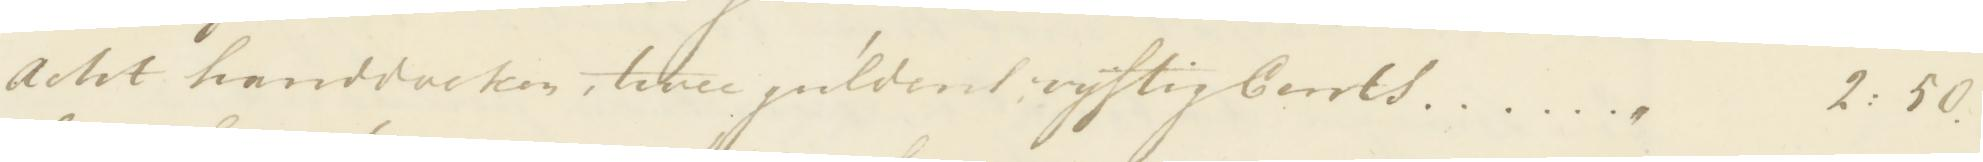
acht handdoeken, twee guldens; vijftig Cents. „ 2:50.
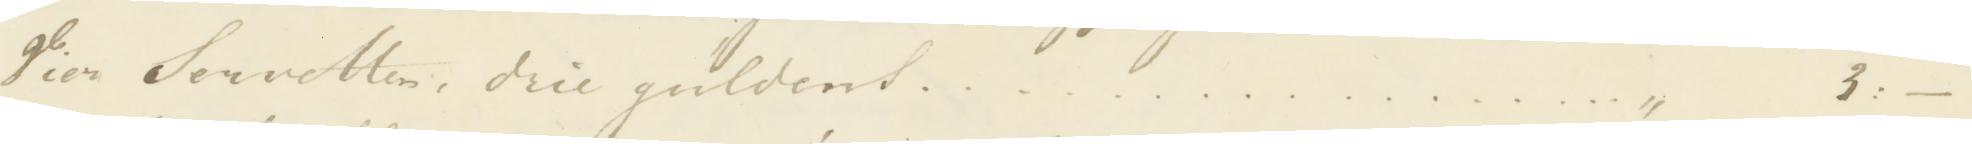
Vier servetten, drie guldens . . . . . . . . . . . . . . . . „ 3:—
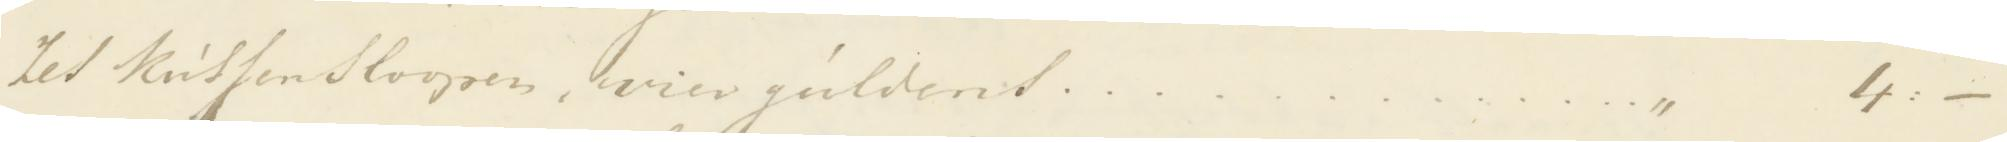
zes kussen sloopen, vier guldens. . . . . . . . . . . . „ 4:—
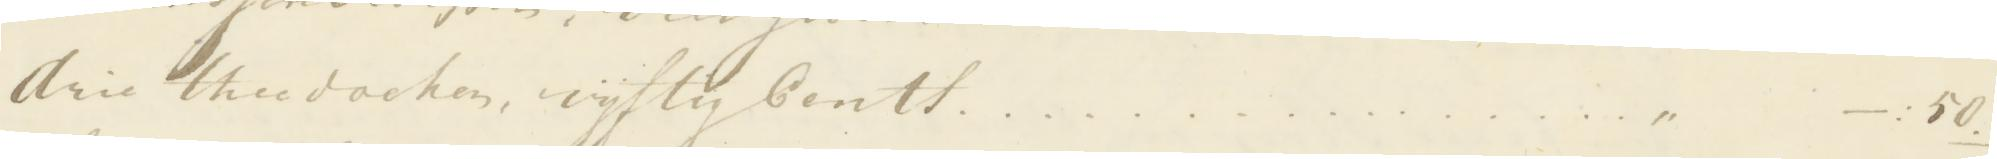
drie theedoeken, vijftig Cents . . . . . . . . . . . . . . . „ —:50.
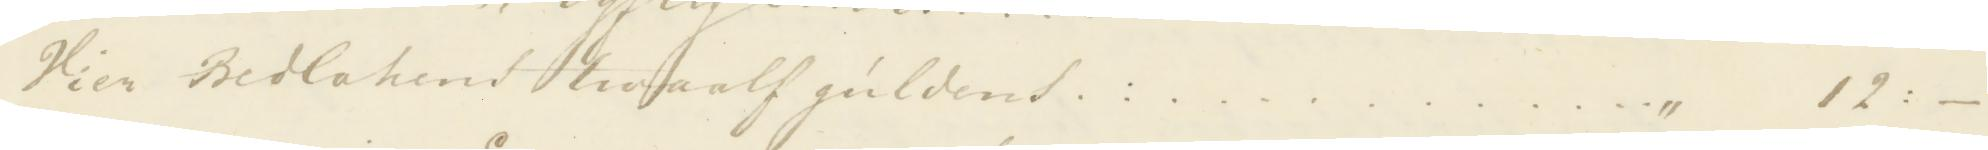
Vier Bedlakens Twaalf guldens . . . . . . . . . . . . . .„ 12:—
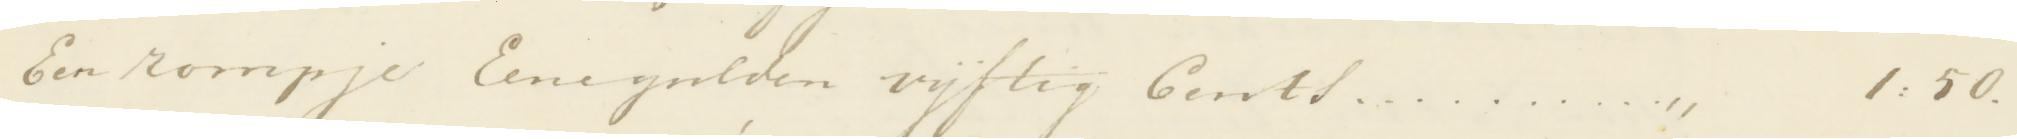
Een rompje Eene gulden vijftig Cents . . . . .. . . . . „ 1:50
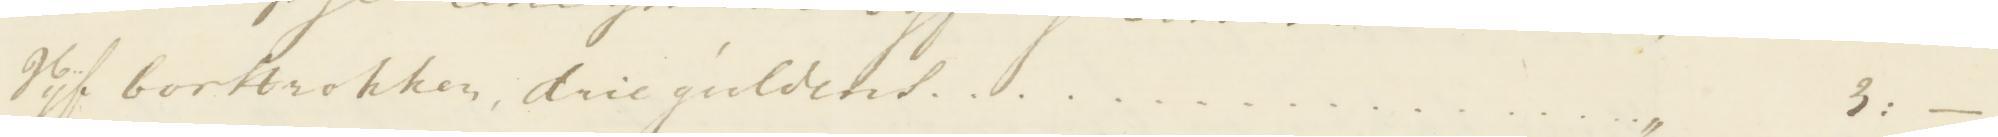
Vijf borstrokken, drie guldens. . . . . . . . . . . . . . . . „ 3:—
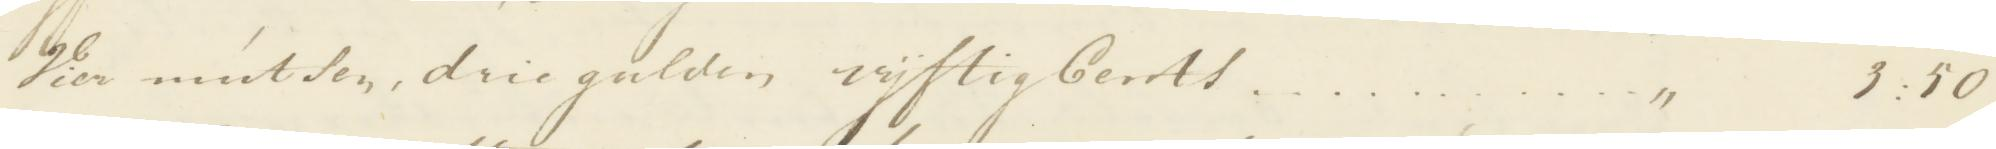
Vier mutsen, drie gulden vijftig Cents. . . . . . . . . . „ 3:50
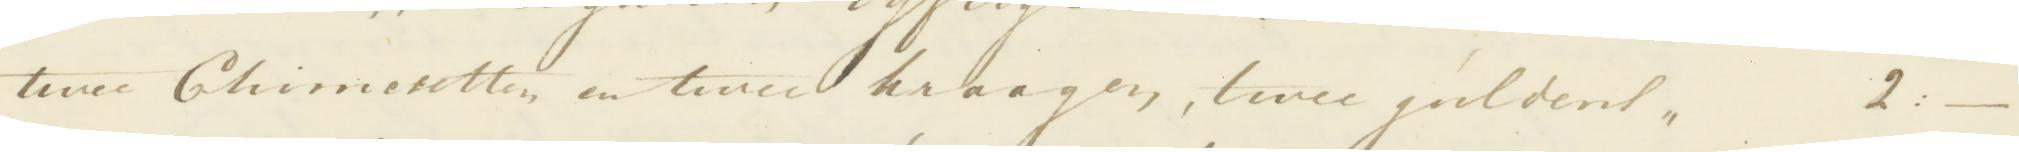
twee Chimesetten en twee kraagen, twee guldens „ 2:—
